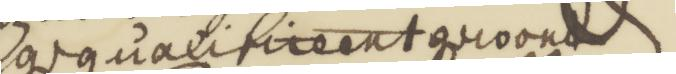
gequalificeert geworden
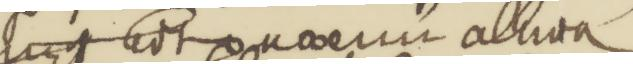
uiijt het prevenu alhier
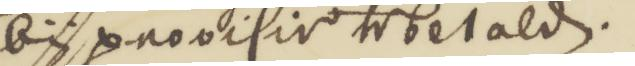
bij provisie te betalen.
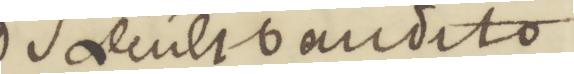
de schult van dito
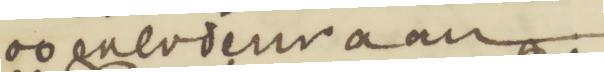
overledene aan
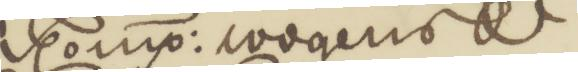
'EComp: wegens de
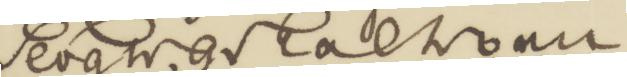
Slegte, gehalte van
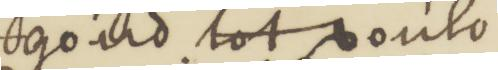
goud tot poulo
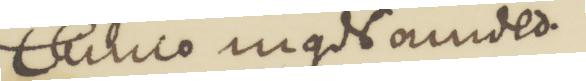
chinco ingesameld.
